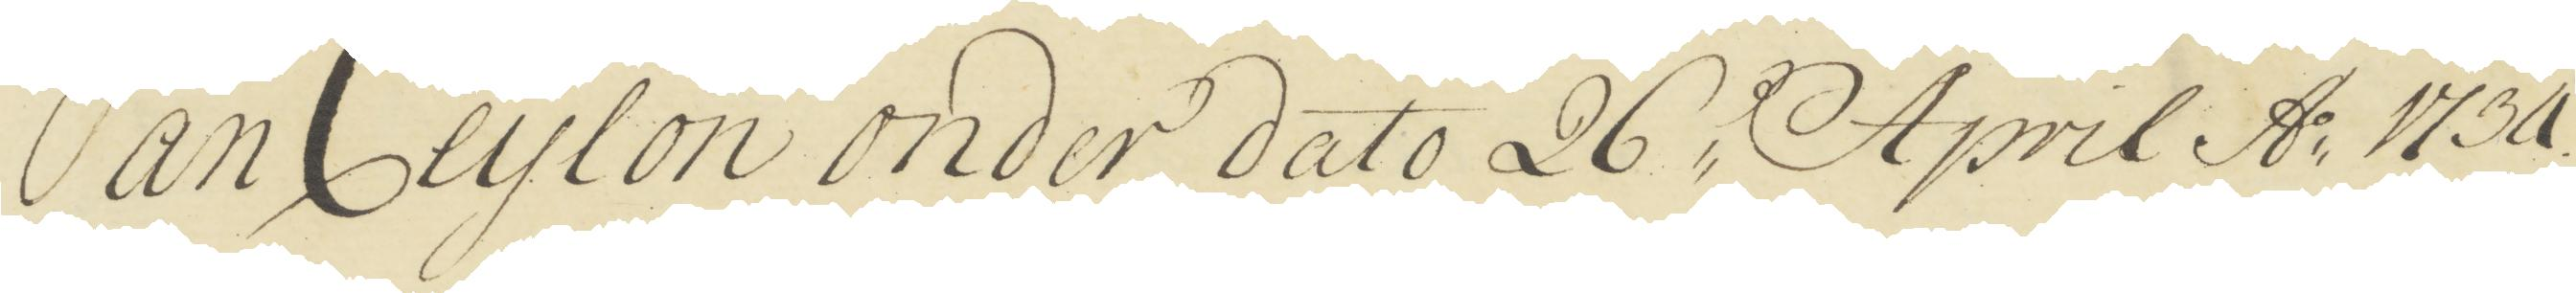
Van Ceylon onder dato 26„e April A„o 1734.
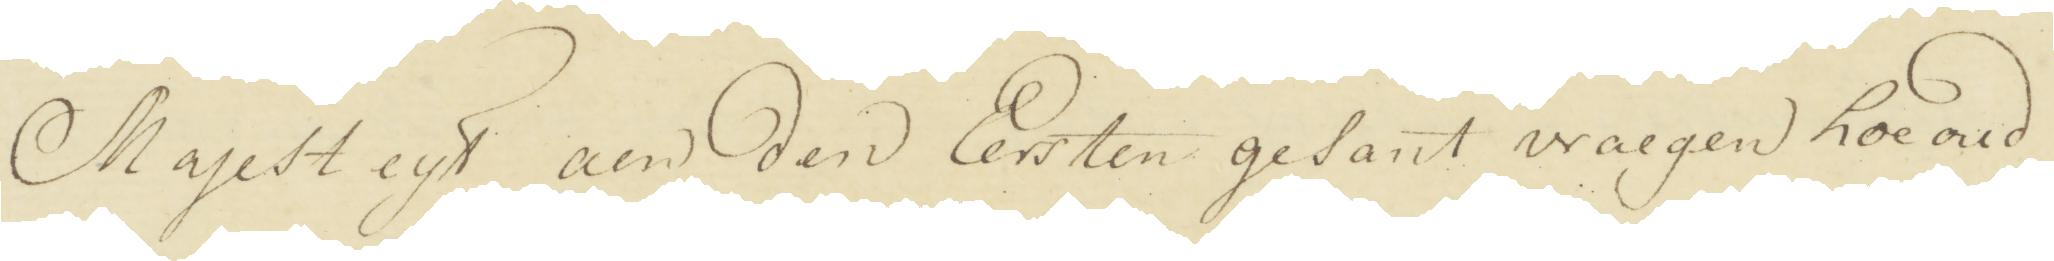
Majesteyt aen den Eersten gesant vraegen hoe oud
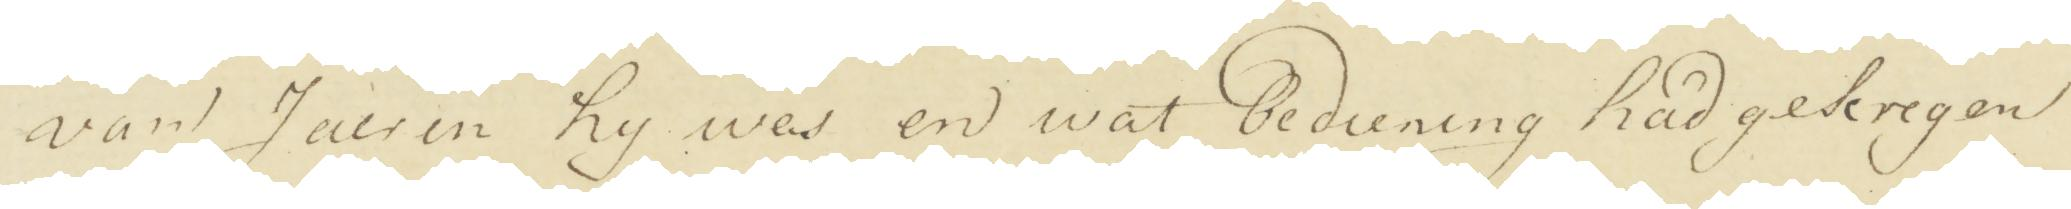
van Jaeren hy was en wat bediening had gekregen
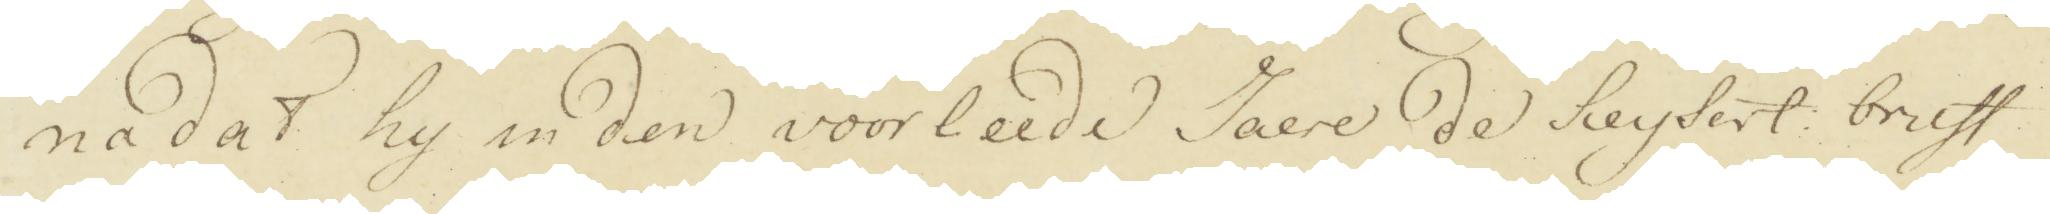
na dat hy in den voorleede Iaere de keyserlijke brieff
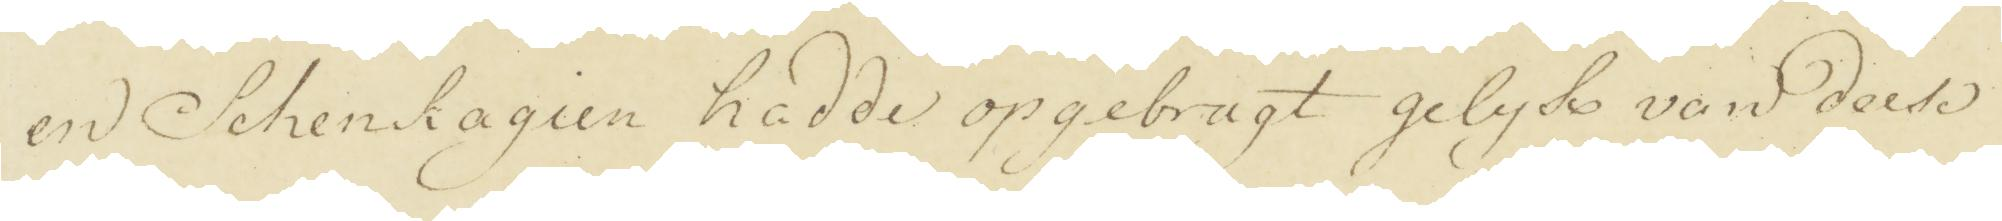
en Schenkagien hadde opgebragt gelyk van deese
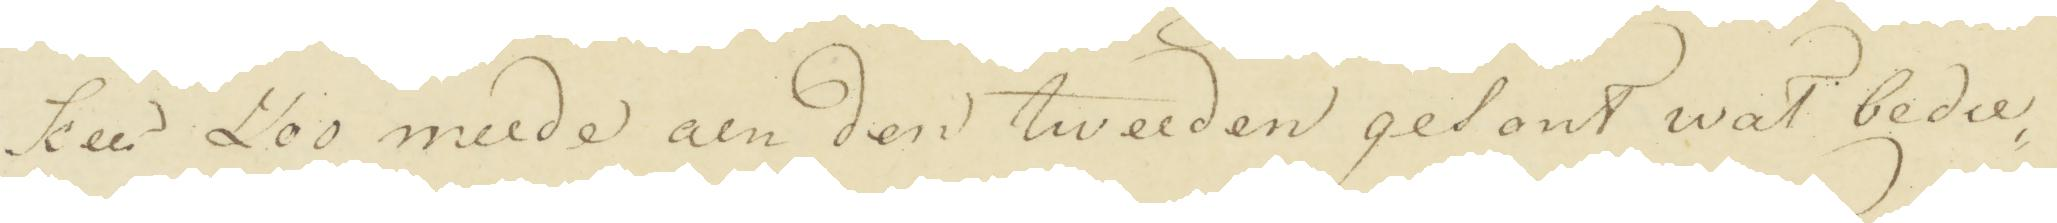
keer Zoo meede aen den tweeden gesont wat bedie„
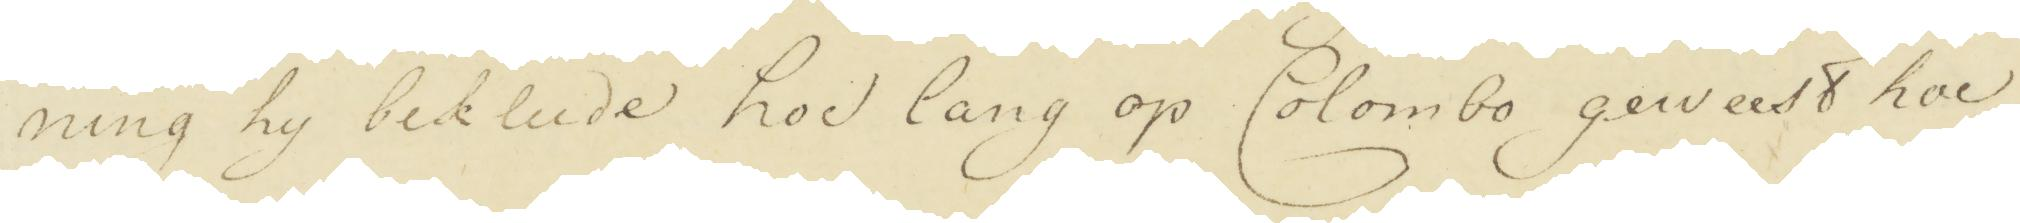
ning hy bekleede hoe lang op Colombo geweest hoe
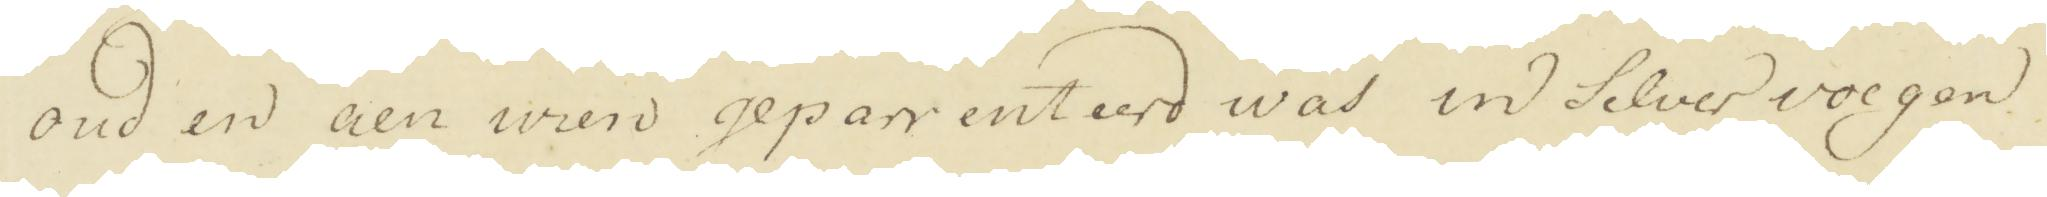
oud en aen wien geparrenteerd was in selver voegen.
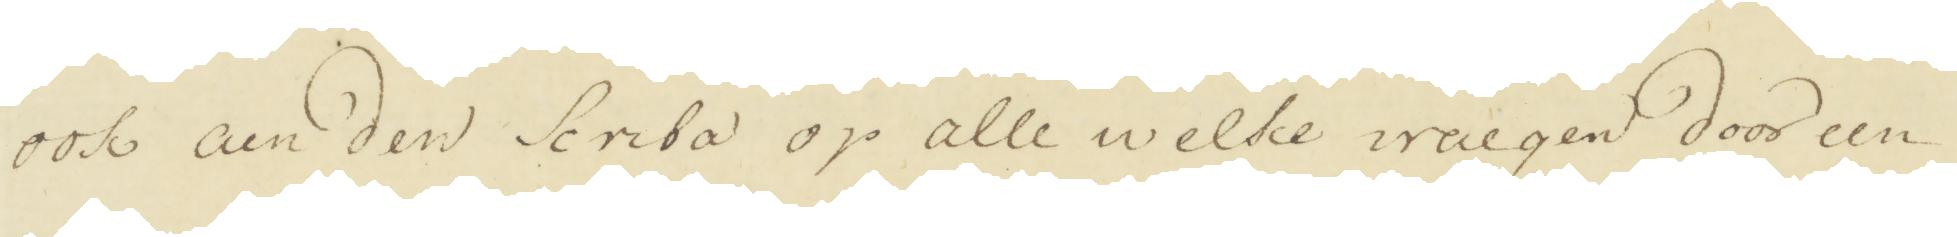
ook aen den Scriba op alle welke vraegen door een
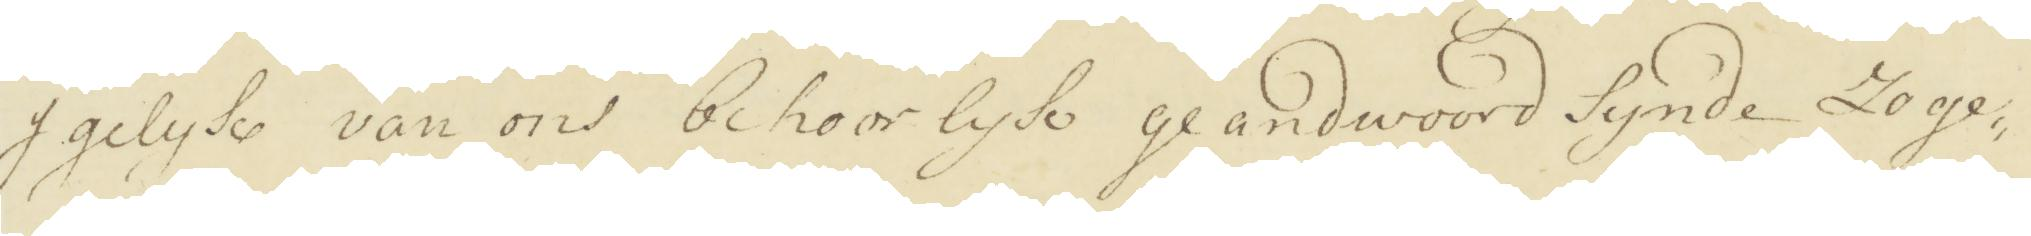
s gelyk van ons behoorlyk geandwoord Synde Zoge„
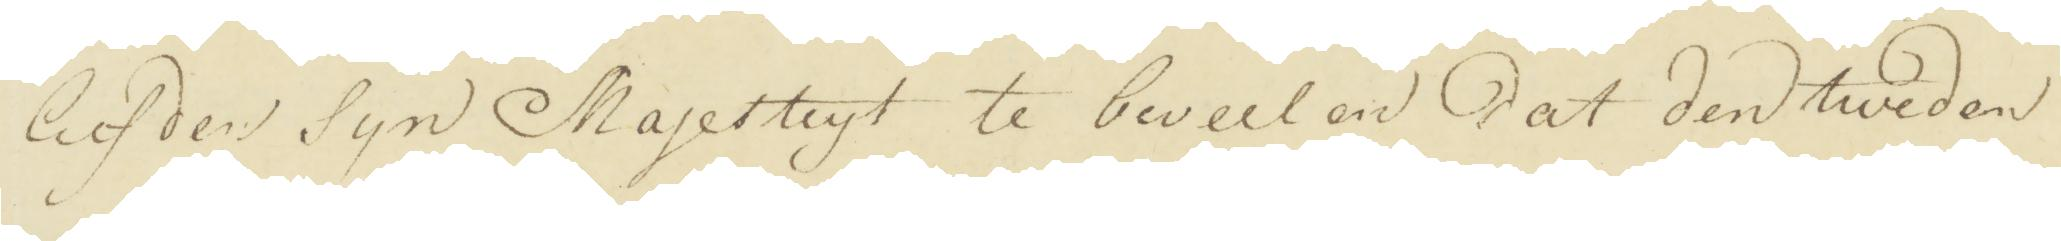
liefden Syn Majesteyt te beveelen dat den tweden
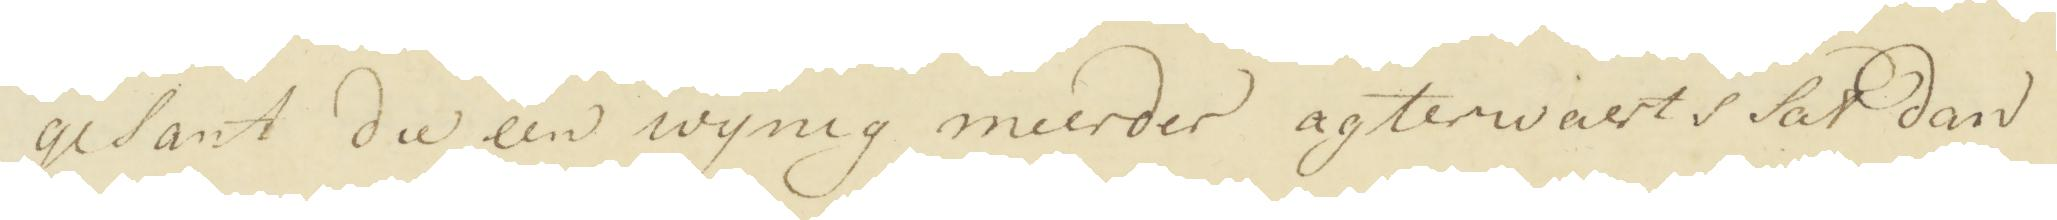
gesant die een wynig meerder agterwaerts sat dan
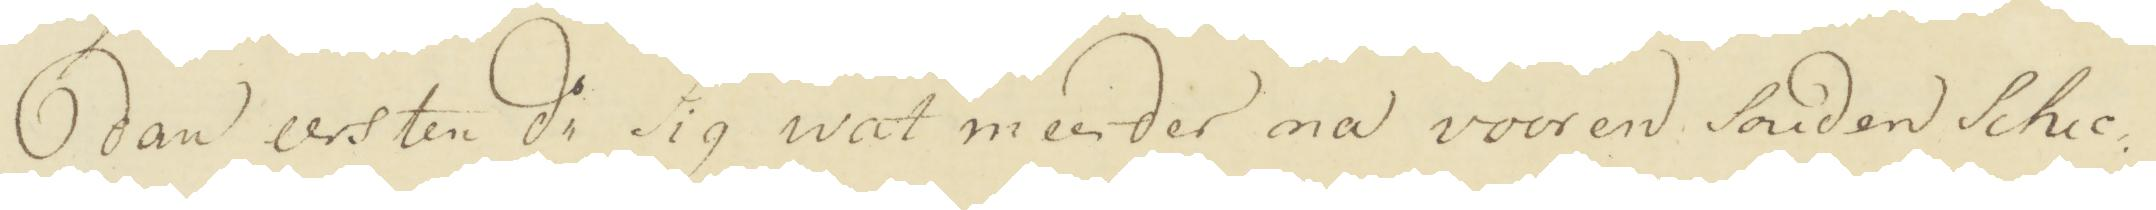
dan eersten d„o Sig wat meerder na vooren Souden Schic„
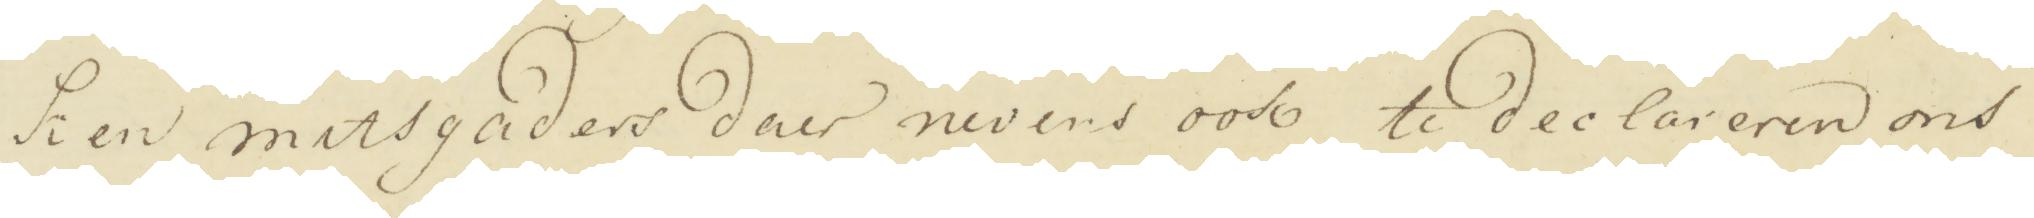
ken mitsgaders daer nevens ook te declareren ons
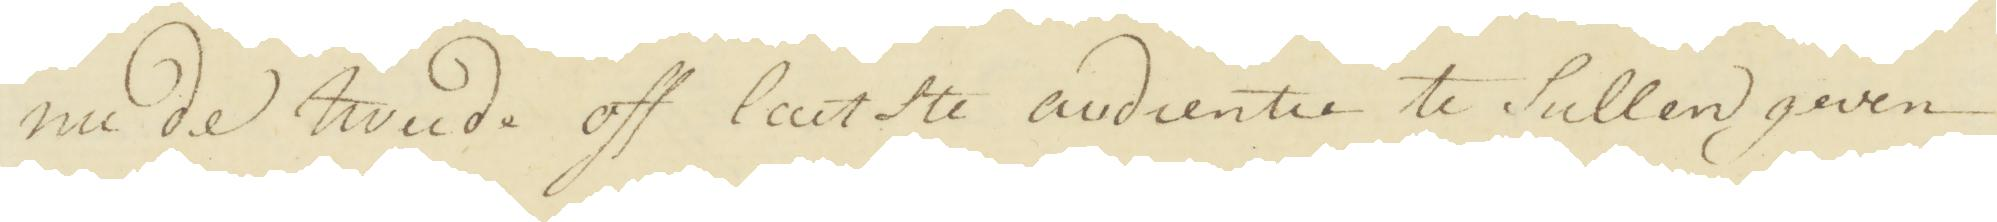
nu de tweede off laetste audientie te Sullen geven
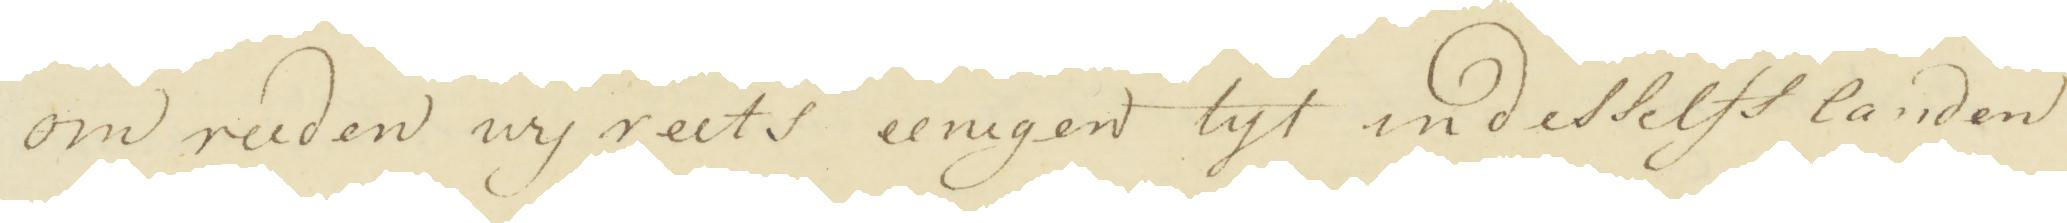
om reeden wy reets eenigen tyt in desselfs landen
